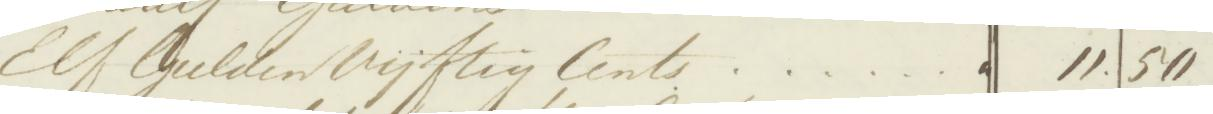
Elf Gulden Vijftig Cents . . . . . . „ 11.50
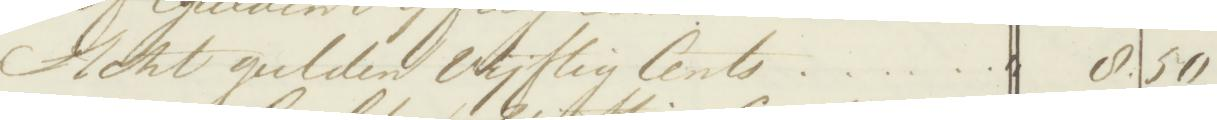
Acht gulden Vijftig Cents . . . . . . „ 8.50
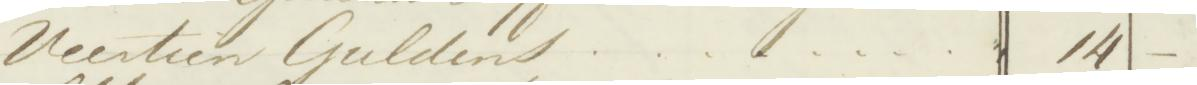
Veertien Guldens . . . . . . . . „ 14.—
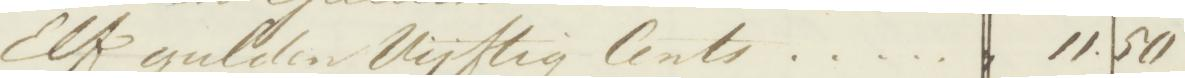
Elf gulden Vijftig Cents . . . . . „ 11.50
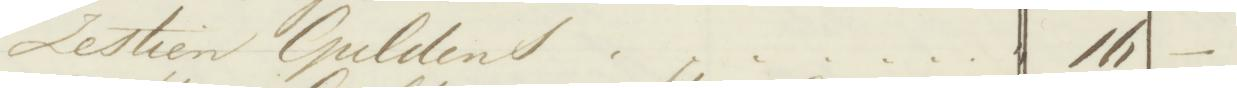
Zestien Guldens . . . . . . . „ 16 —
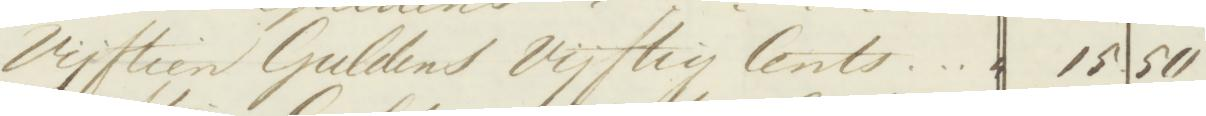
Vijftien Guldens Vijftig Cents . . . „ 15.50
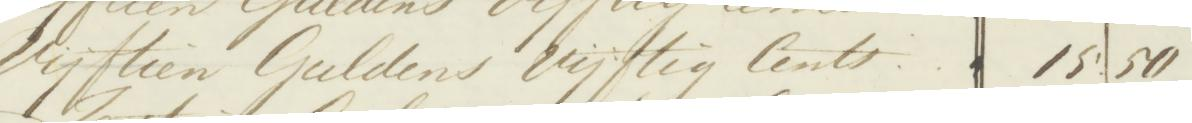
Vijftien Guldens vijftig Cents . . „ 15.50
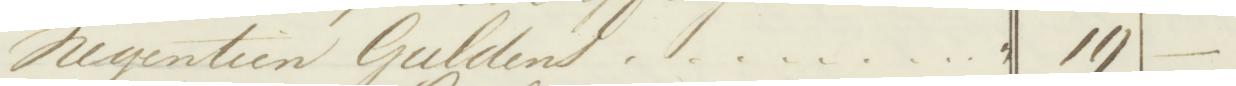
Negentien Guldens . . . . . . . . . „ 19 —
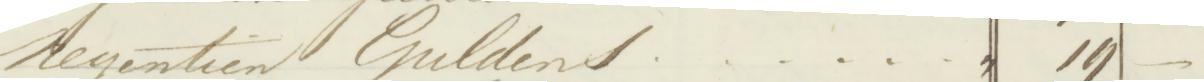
Negentien Guldens . . . . . . „ 19 —
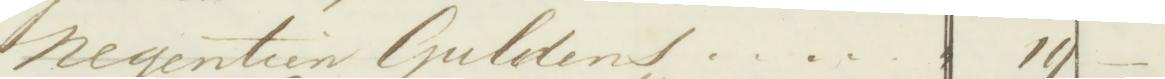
negentien Guldens . . . . . „ 19 —
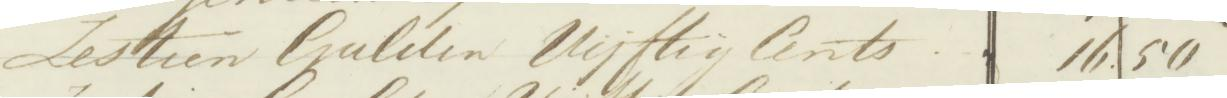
Zestien Gulden Vijftig Cents . . „ 16.50
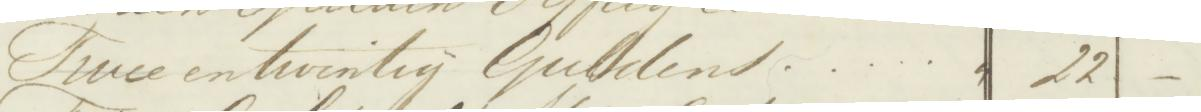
Twee en twintig Guldens . . . . . „ 22 —
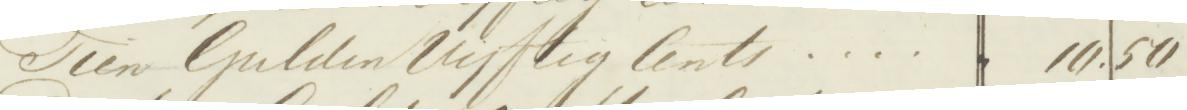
Tien Gulden Vijftig Cents . . . . „ 10.50
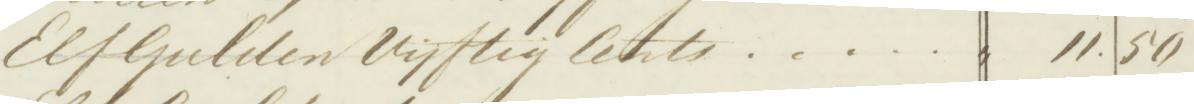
Elf Gulden Vijftig Cents . . . . . „ 11.50
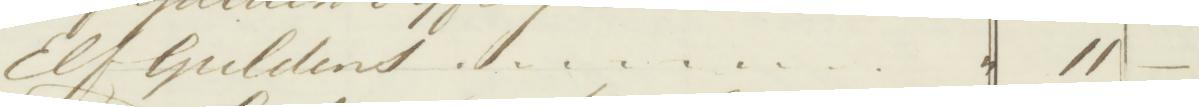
Elf Guldens . . . . . . . . . „ 11 —
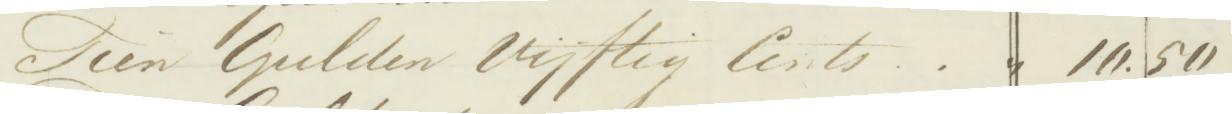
Tien Gulden Vijftig Cents . . „ 10.50
